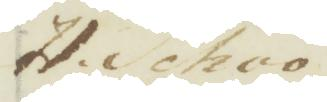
H. Schoo
